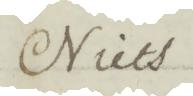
Niets
